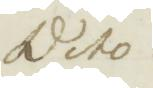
Dito . . . . . . . . .
